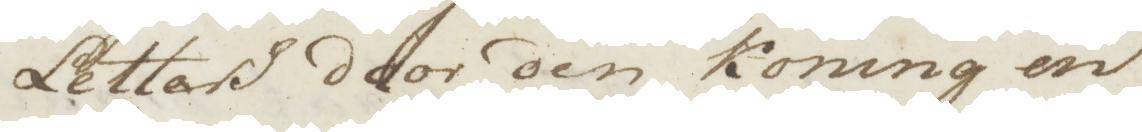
Letters door den Koning en
